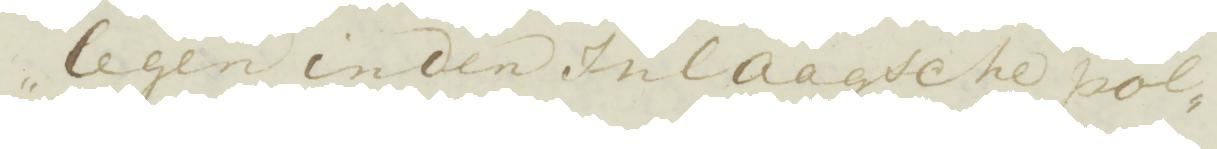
„legen in den Jnlaagsche pol„
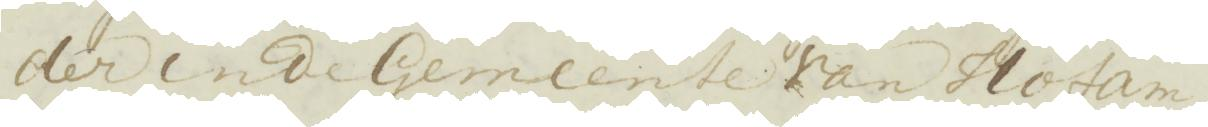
der en de Gemeente van Hofam=
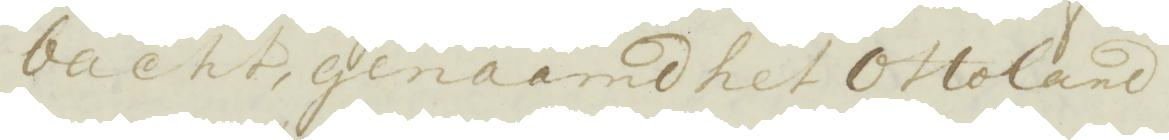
bacht, genaamd het Ottoland
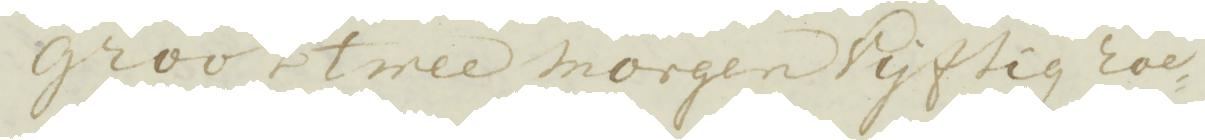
groot twee morgen Vijftig roe„
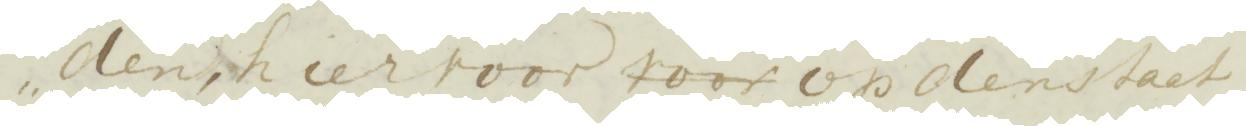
„den, hiervoor voor op den staat
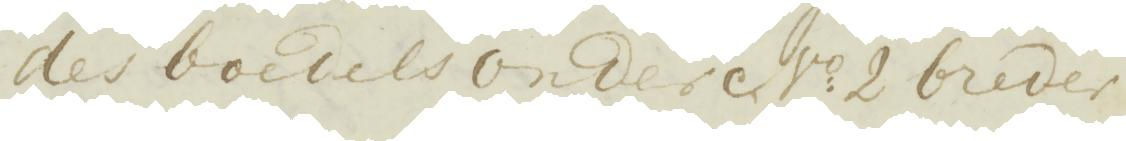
des boedels onder N:o 2 breder
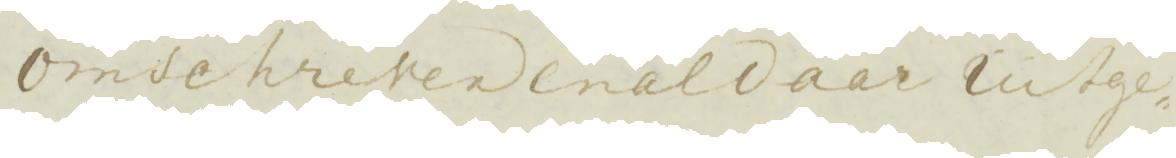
omschreven en aldaar uitge„
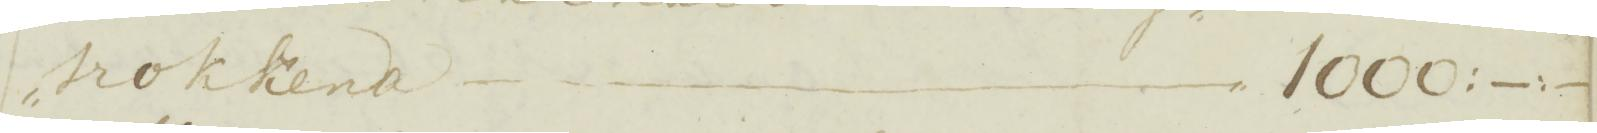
„trokken a - - - „ 1000:—:—
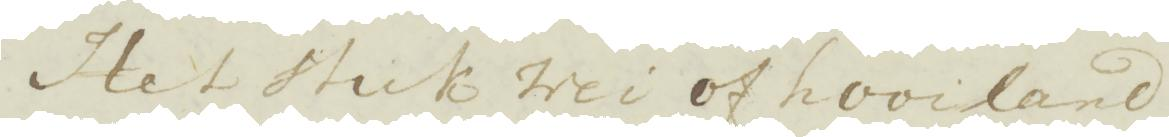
Het stuk wei of hooiland
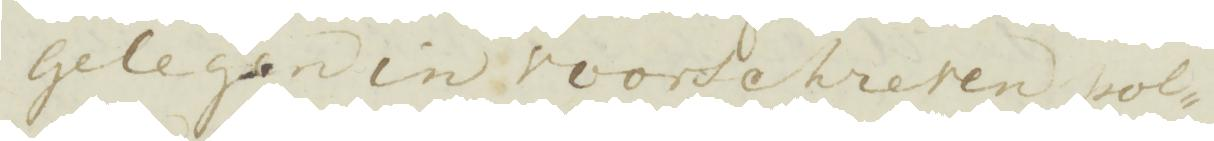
gelegen in voorschreven pol„
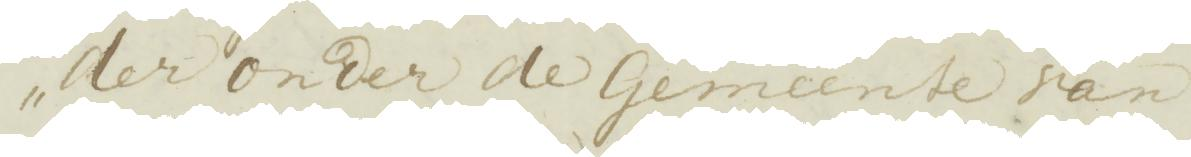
„der onder de Gemeente van
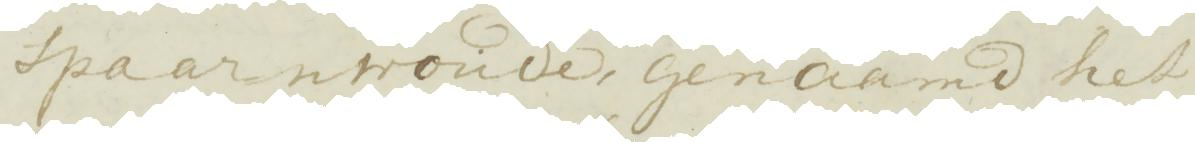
spaarnwoude, genaamd het
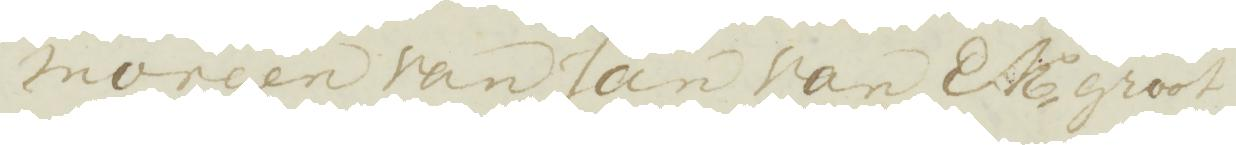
morgen van Jan van Ek, groot
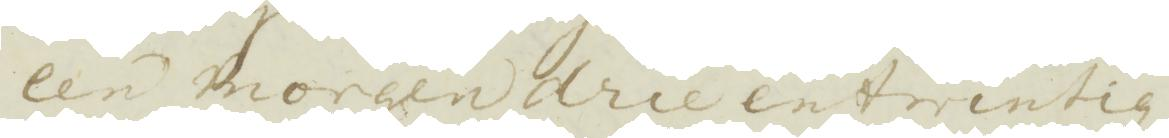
een morgen drie en twintig
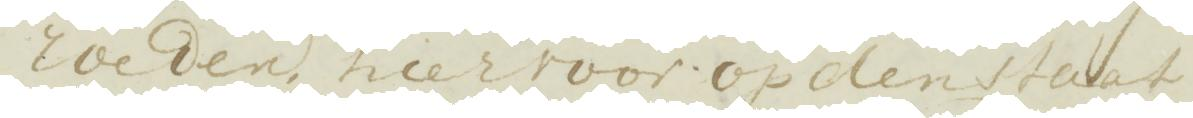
roeden, hiervoor op den staat
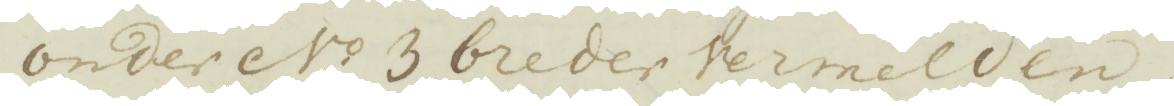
onder N.o 3 breder vermelden
